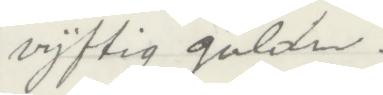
vijftig gulden
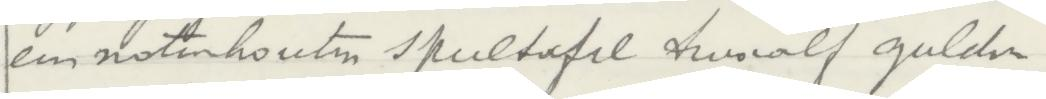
een notenhouten speeltafel twaalf gulden
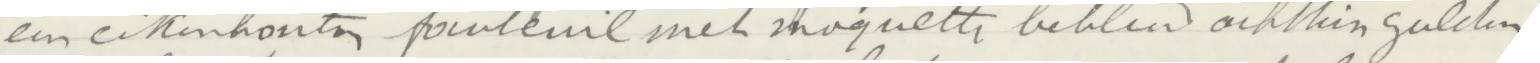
een eikenhouten fauteuil met moquette bekleed achttien gulden
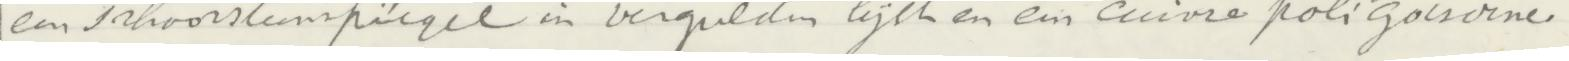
een schoorsteenspiegel in vergulden lijst en een cuivre poli gasorne
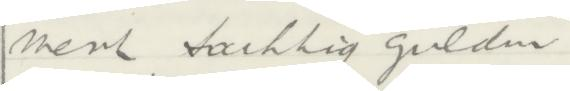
ment tachtig gulden
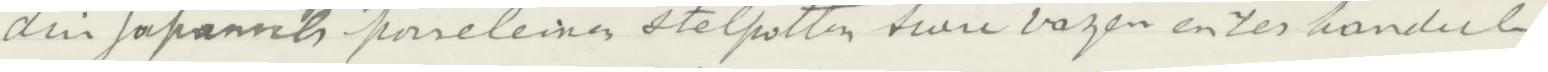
drie japansch porseleinen stelpotten twee vazen en zes honderd
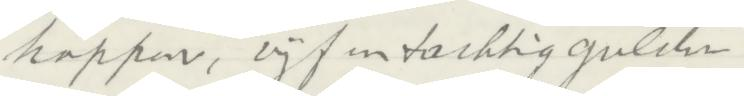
koppen, vijf en tachtig gulden
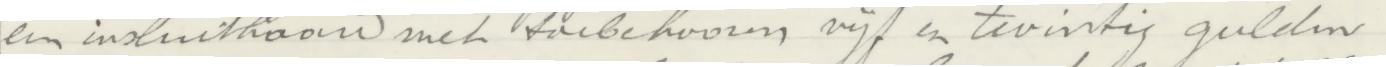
een insluithaard met toebehooren vijf en twintig gulden
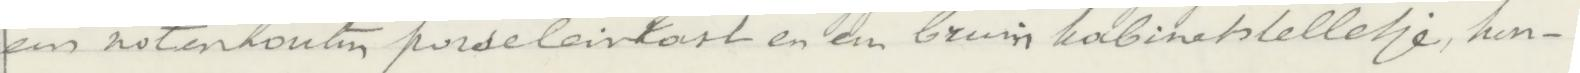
en notenhouten porseleinkast en een bruin kabinetstelletje, hon-
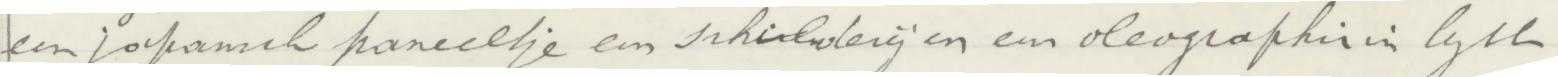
een japansch paneeltje een schilderij en een oleogaphie in lyst
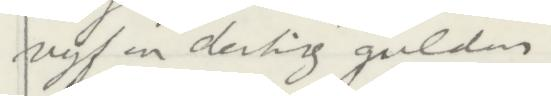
vyf en dertig gulden
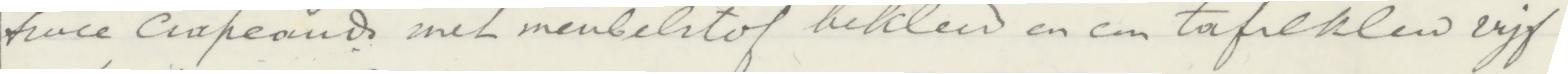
twee Ciapeands met meubelstof bekleed en een tafelkleed vijf
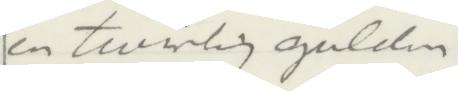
en twintig gulden
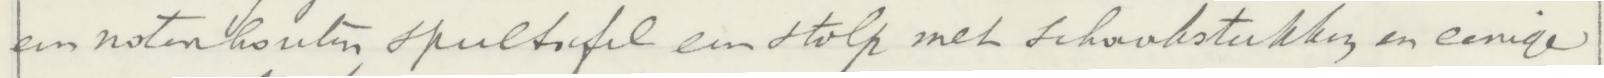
een notenhouten speeltafel een stolp met schaakstukken en eenige
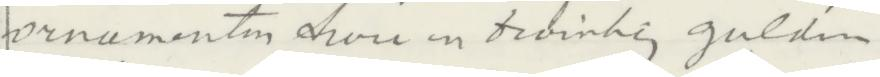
ornamenten twee en twintig gulden
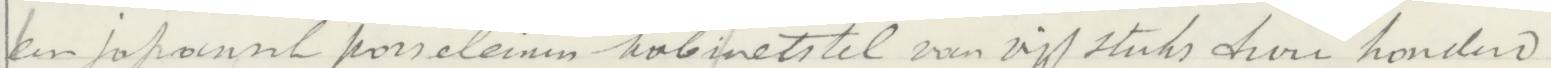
een japansch porseleinen kabinetstel van vijf stuks twee honderd
